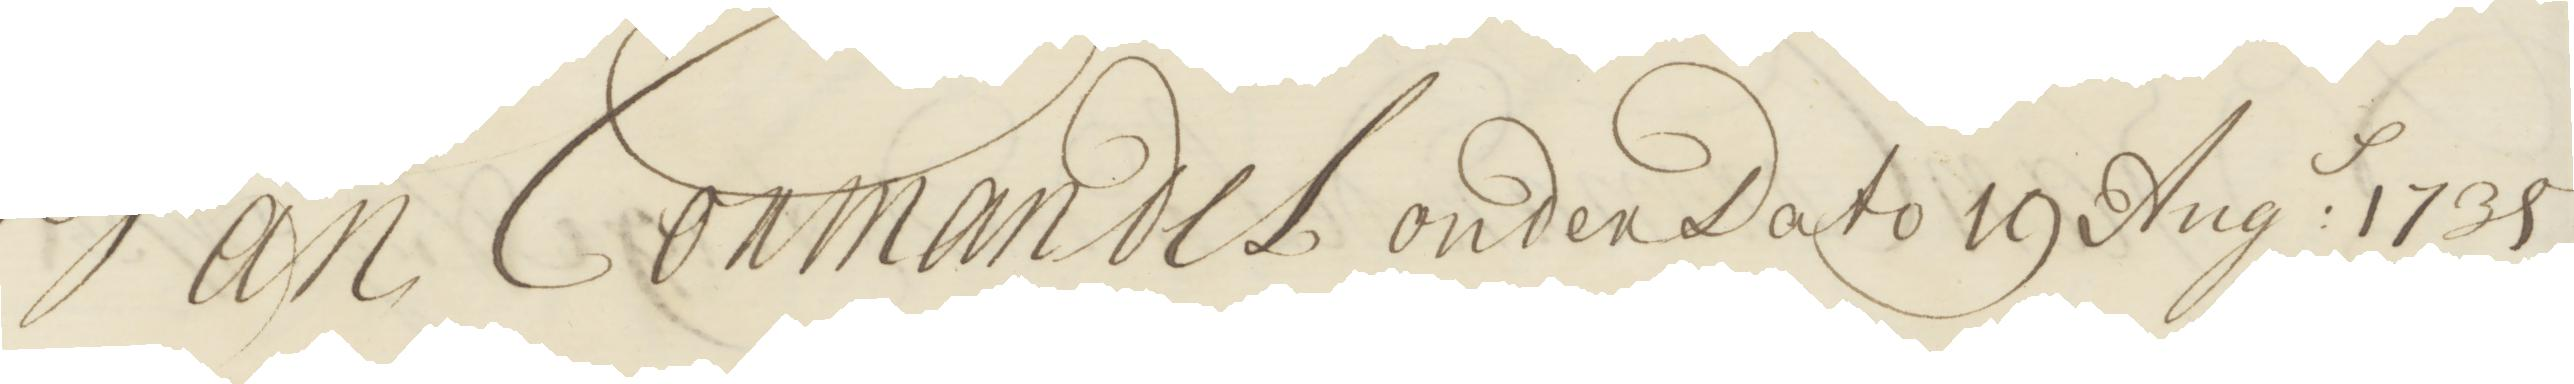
Van Cormandel onder Dato 19 Aug:s 1735
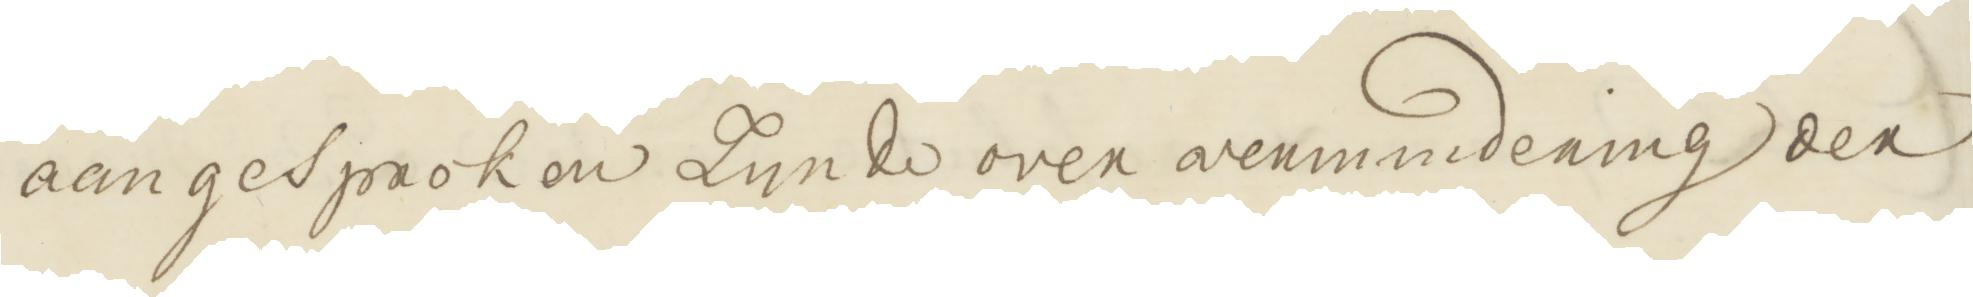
aangesproken zynde over vermindering der
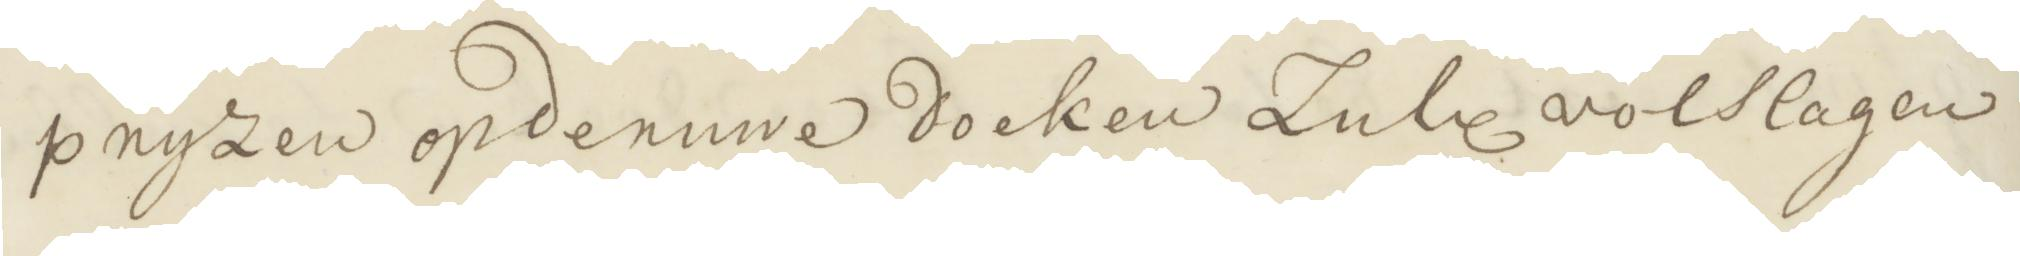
pryzen op de ruwe doeken zulx volslagen
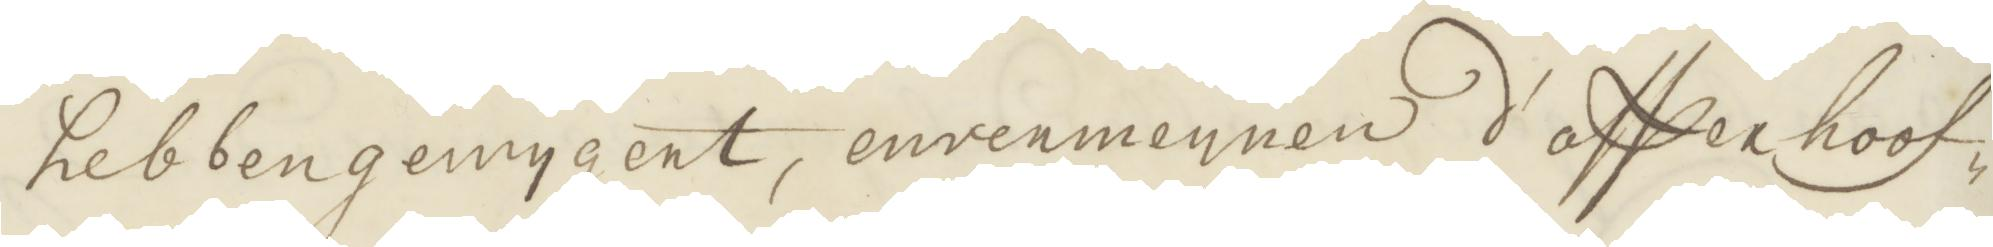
hebben gewygert, envermeynen d’opperhoof„
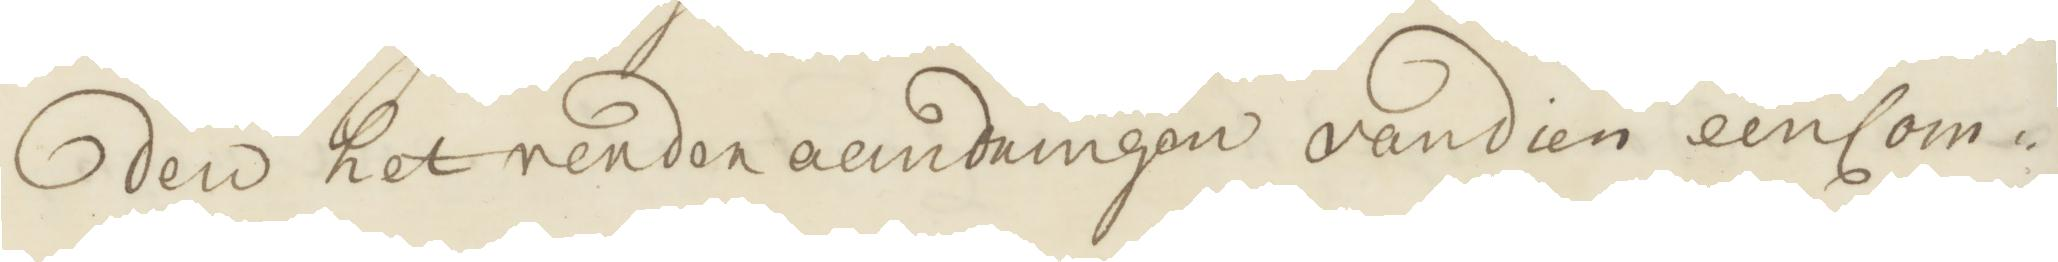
den het verder aandringen van dien een Com„
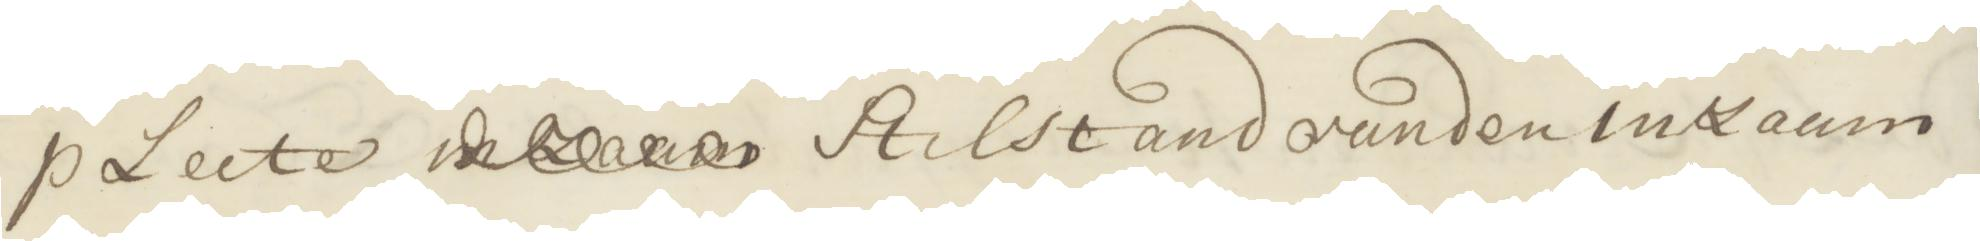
pleete inzaam stilstand van den inzaam
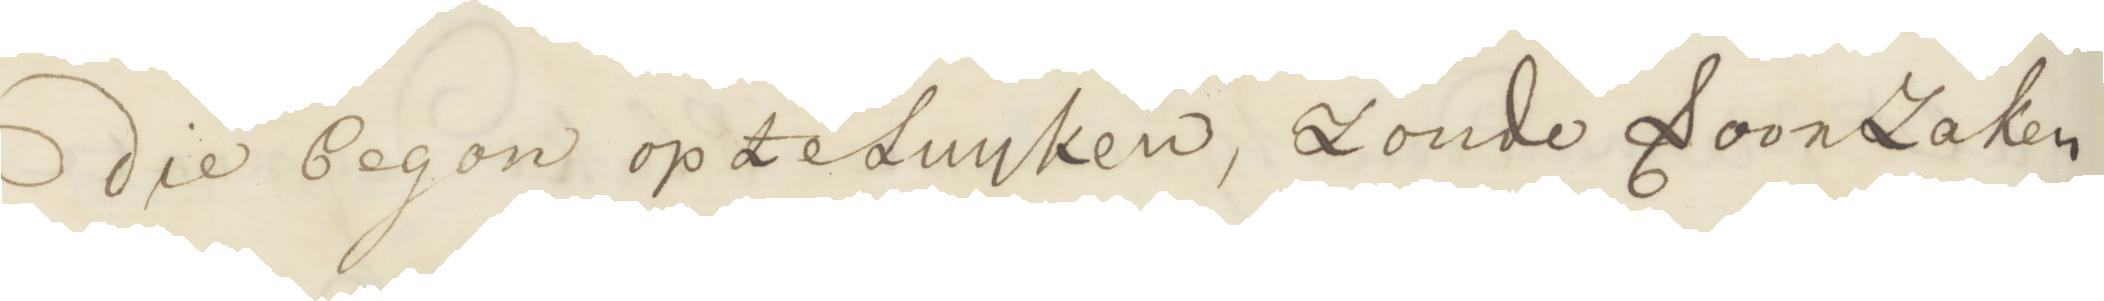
die begon op te luyken, zoude veroorzaken
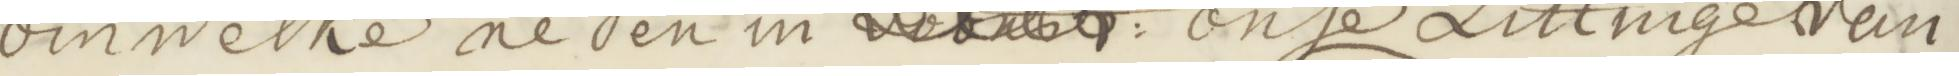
om welke reden in sedert: onse zittinge van
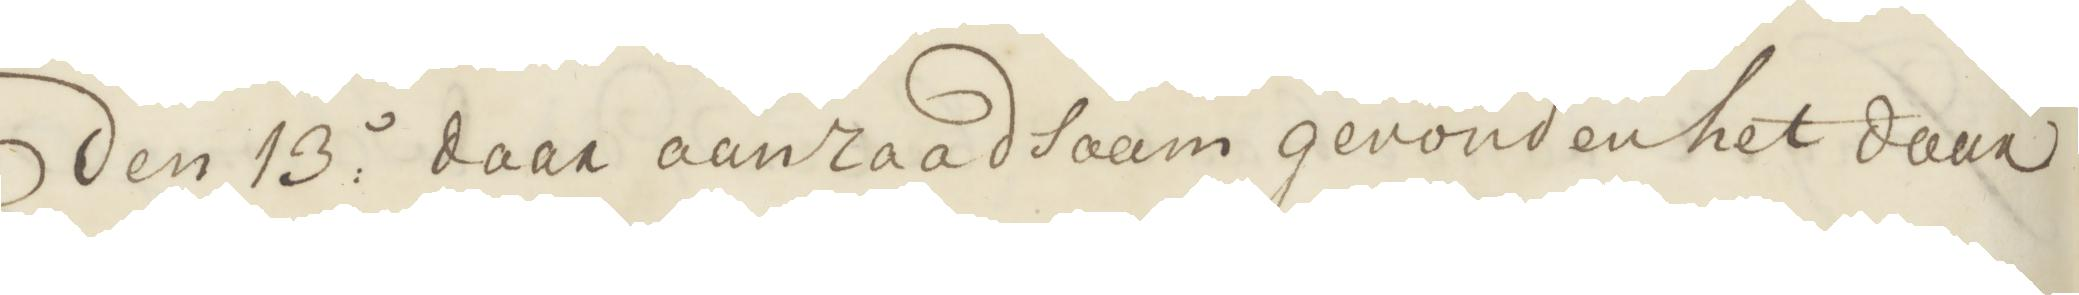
den 13:e daar aanraadsaam gevonden het daar
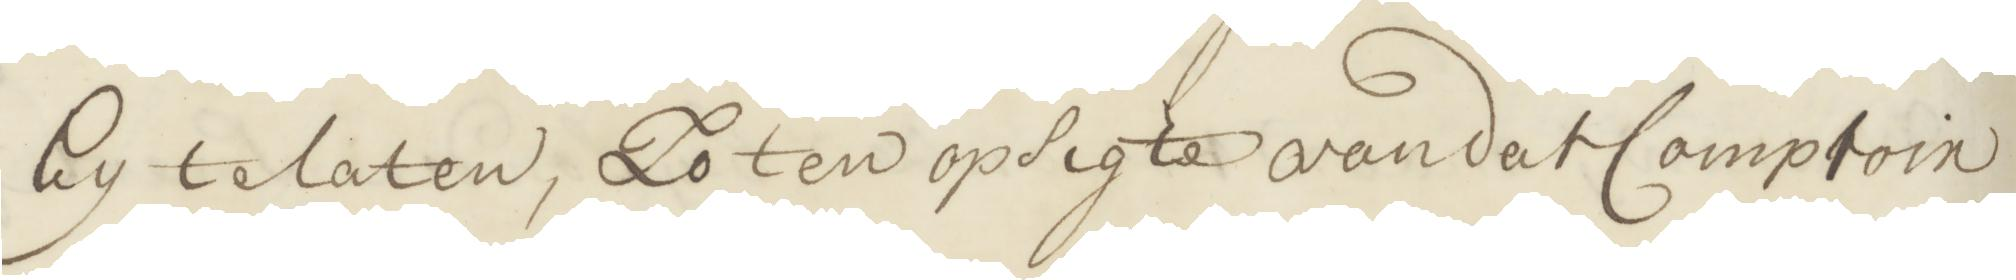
by telaten, zo ten opsigte van dat Comptoir
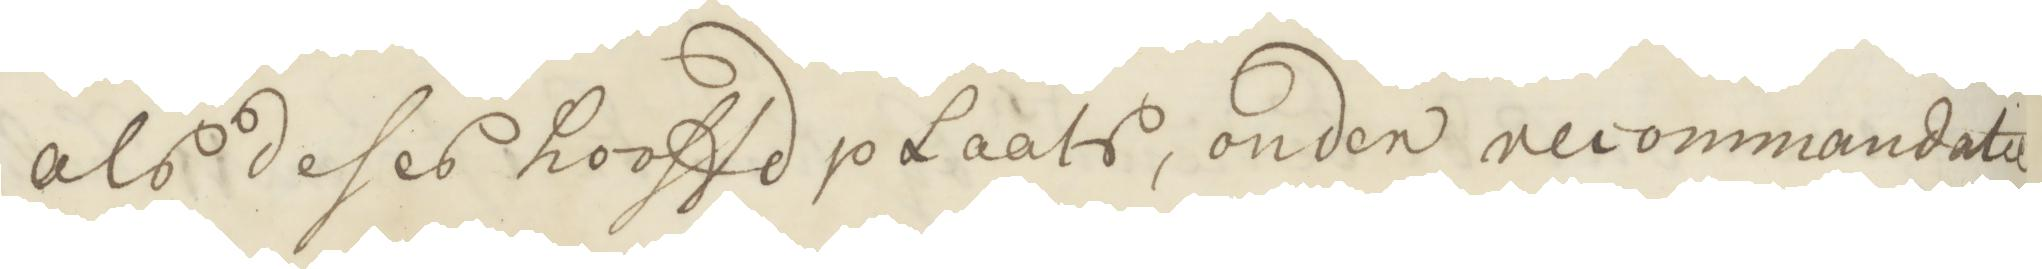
als deses hooffd plaats, onder recommandatie
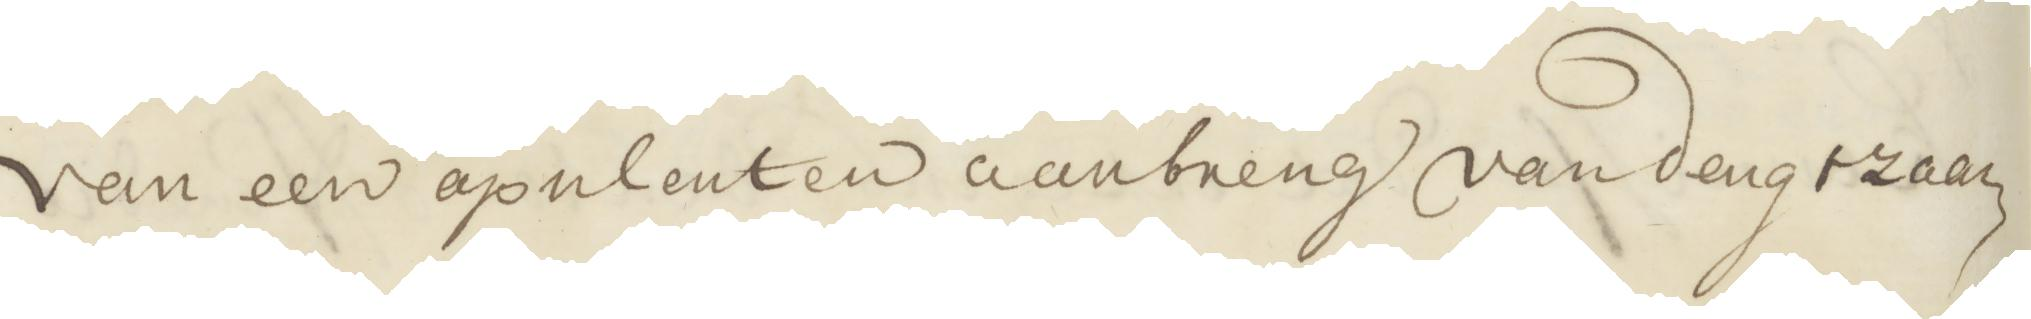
van een opulenten aanbreng van deugtzaam
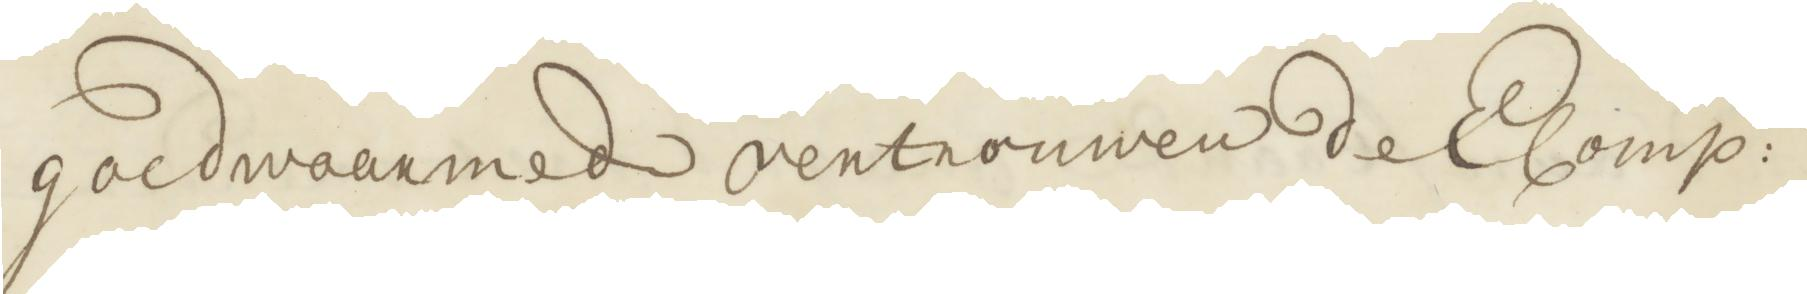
goed waarmede vertrouwen de EComp:e
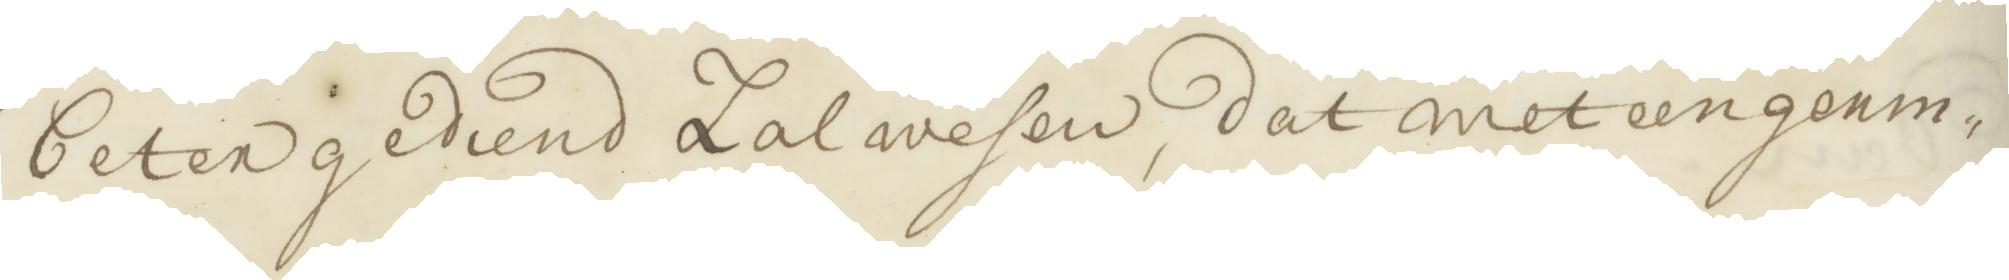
beter gediend zal wesen, dat met een gerin„
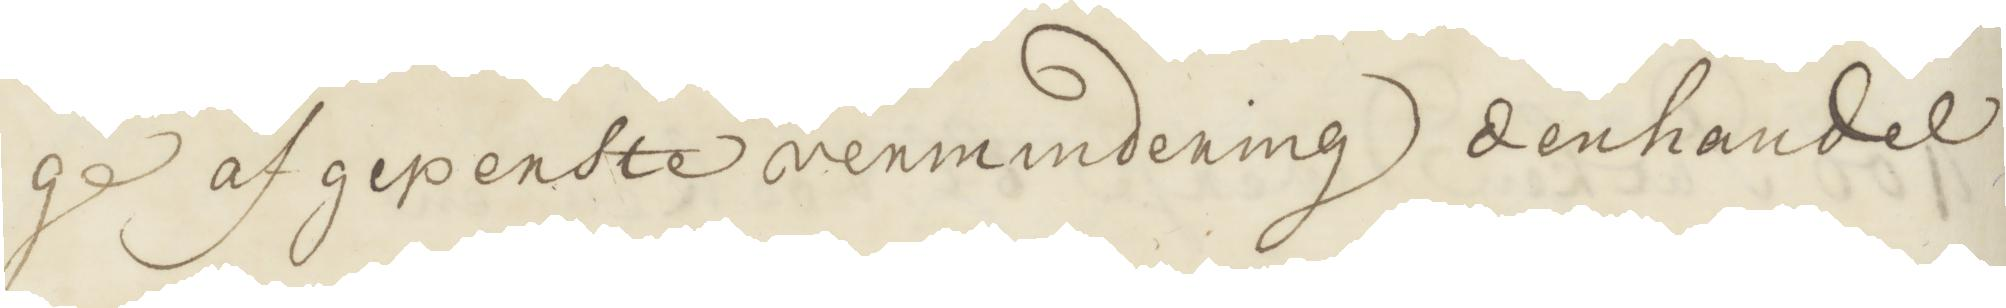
ge af geperste vermindering denhandel
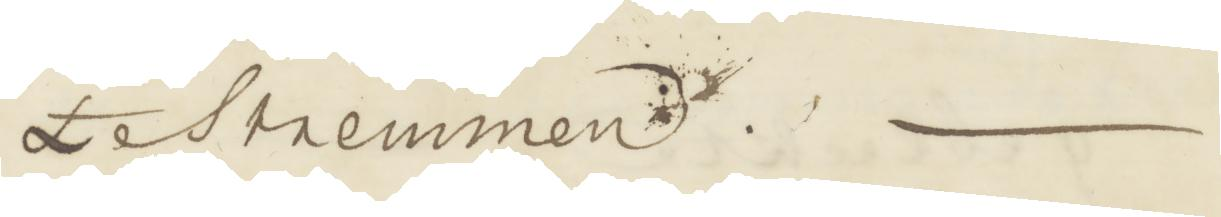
te stremmen. —
